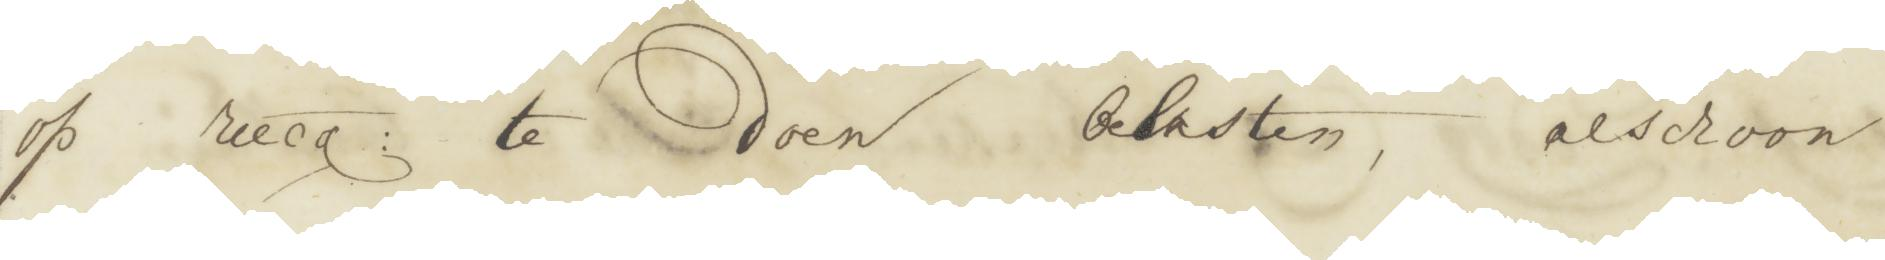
op reecq: te doen belasten, alschoon
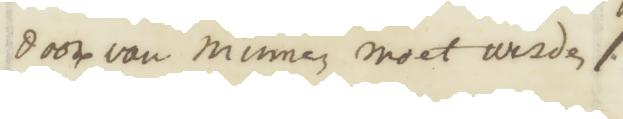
door van minnen moet wirden
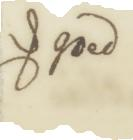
vergoed
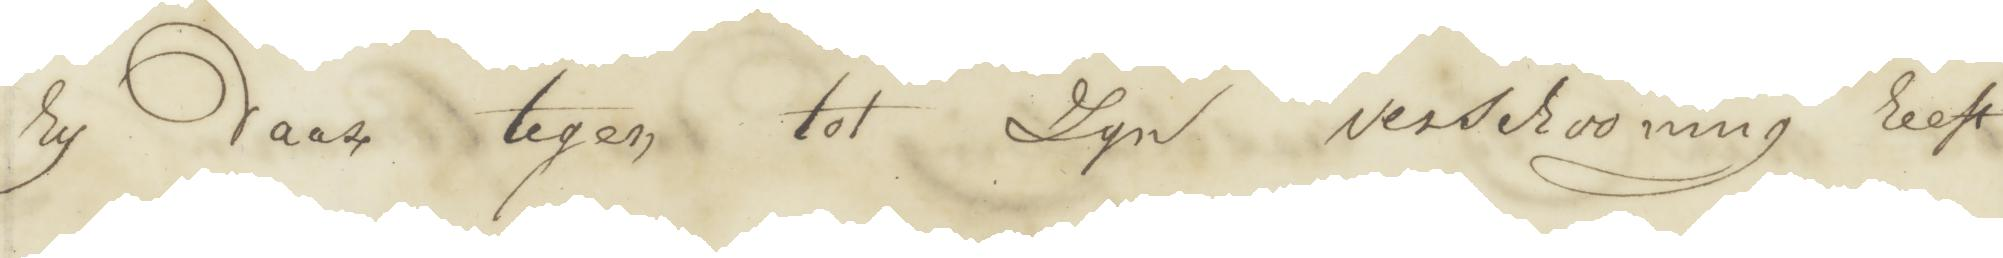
hy daar tegen tot zijn verschooning heeft
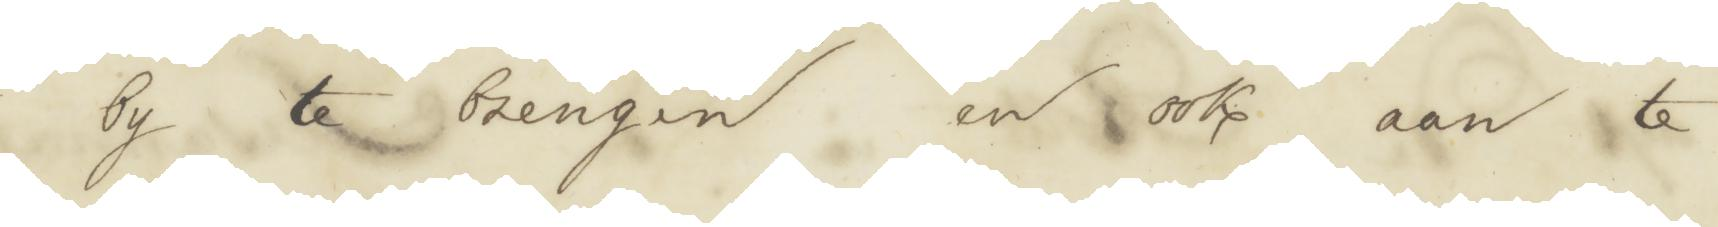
by te bengen en ook aan te
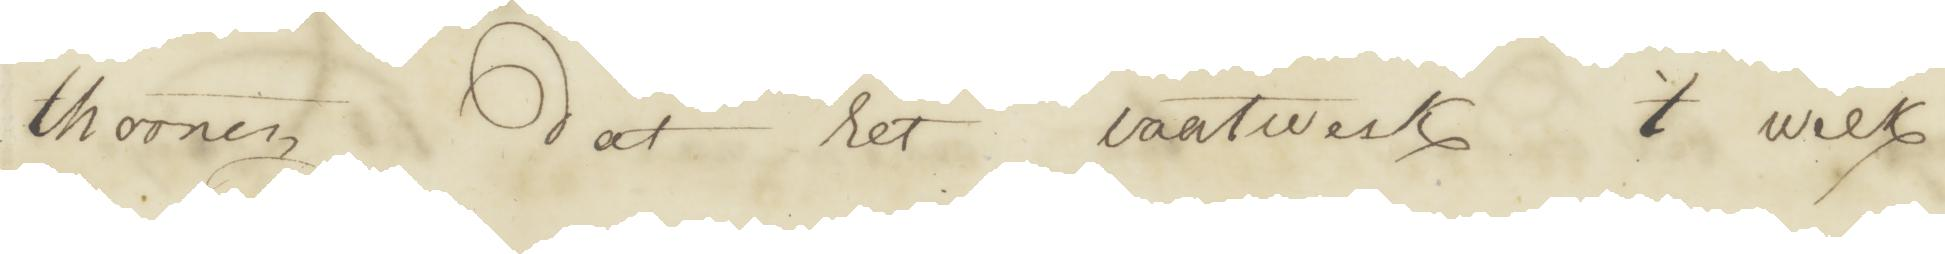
thoonen dat het vaatwerk 't welk
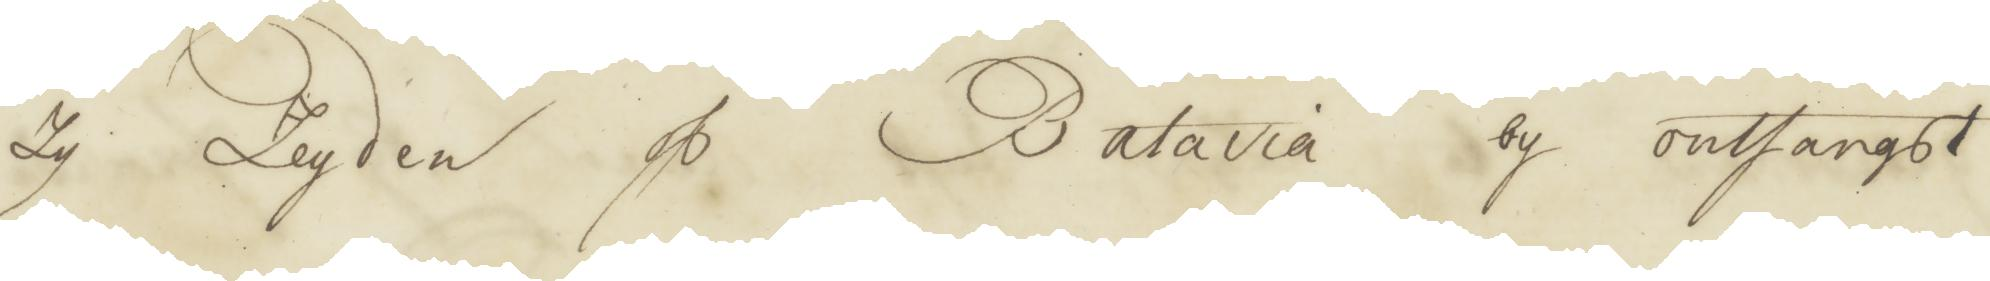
zy zeyden op Batavia by ontfangst
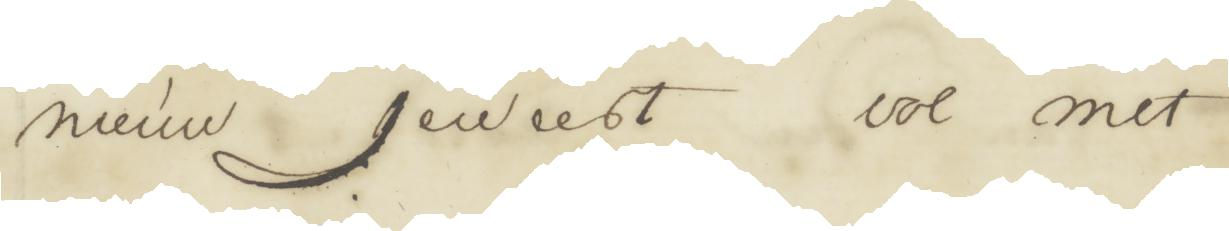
nieuw geweest vol met kleyne worm
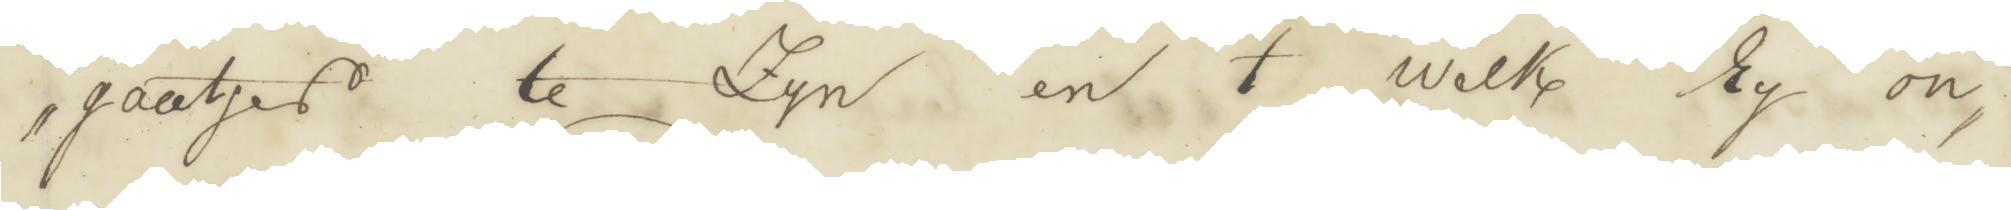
„gaatjes te zyn en t welk hy on„
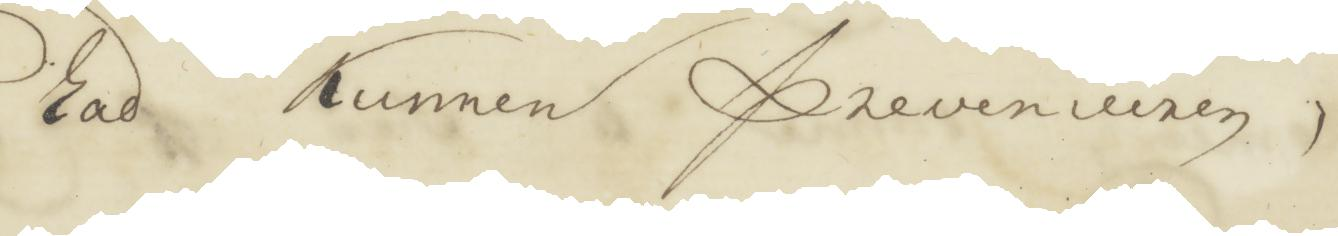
had kunnen prevenieeren,
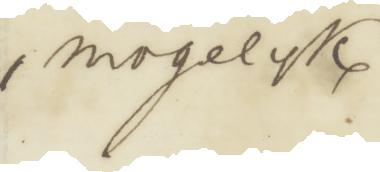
„mogelijk
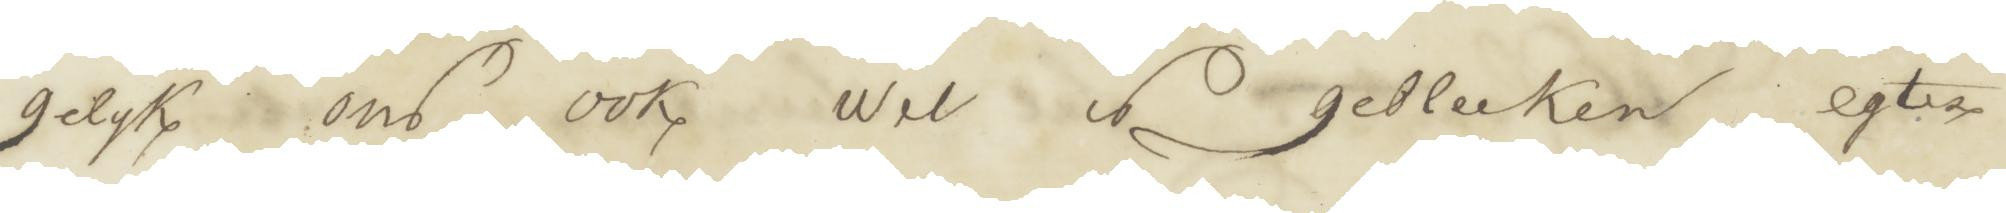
gelyk ons ook wel is gebleeken egter
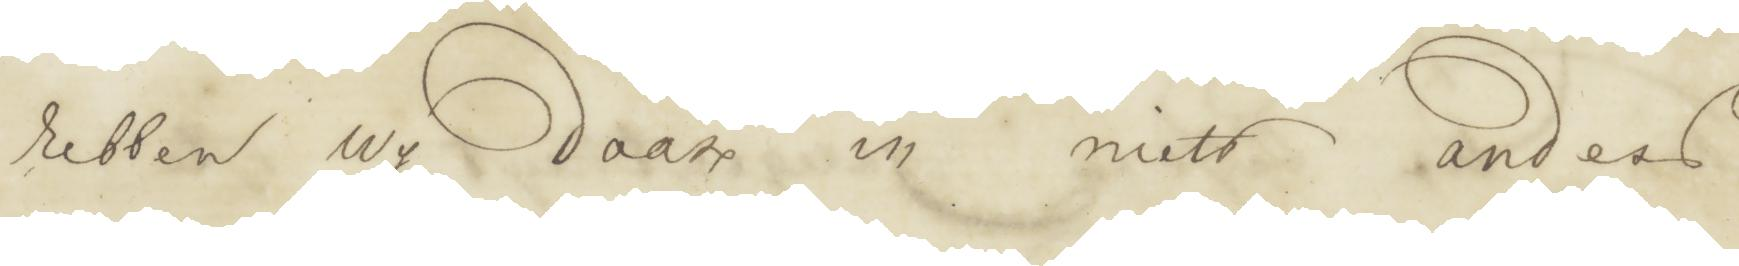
hebben wy daar in niets anders
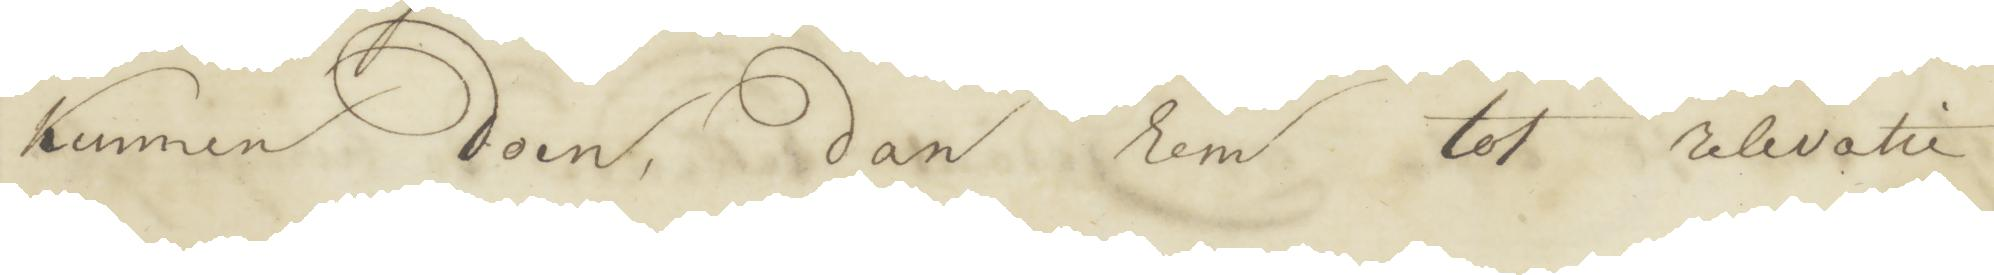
kunnen doen, dan hem tot relevatie
